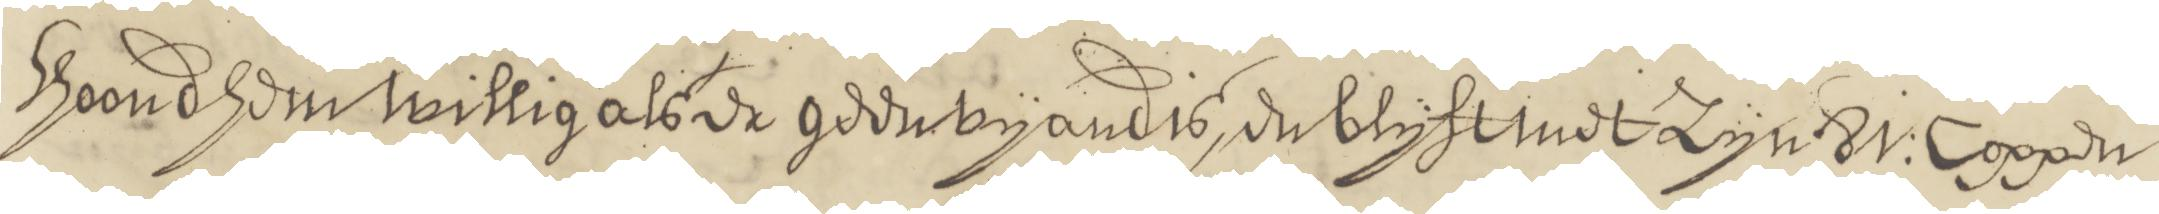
thoond hem willig als er geen vijand is, en blijft met Zijn 81: Coppen
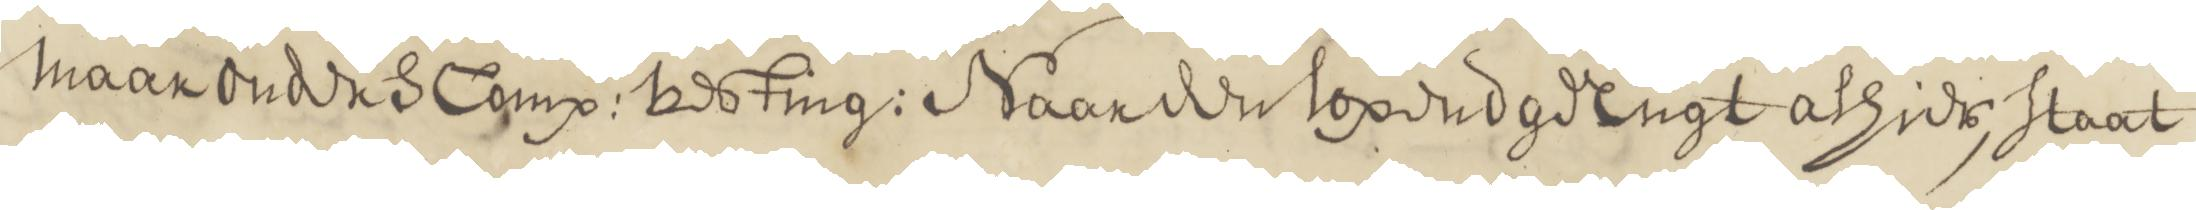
maar onder 's Comp:s vesting: Naar een lopend gerugt alhier, Staat
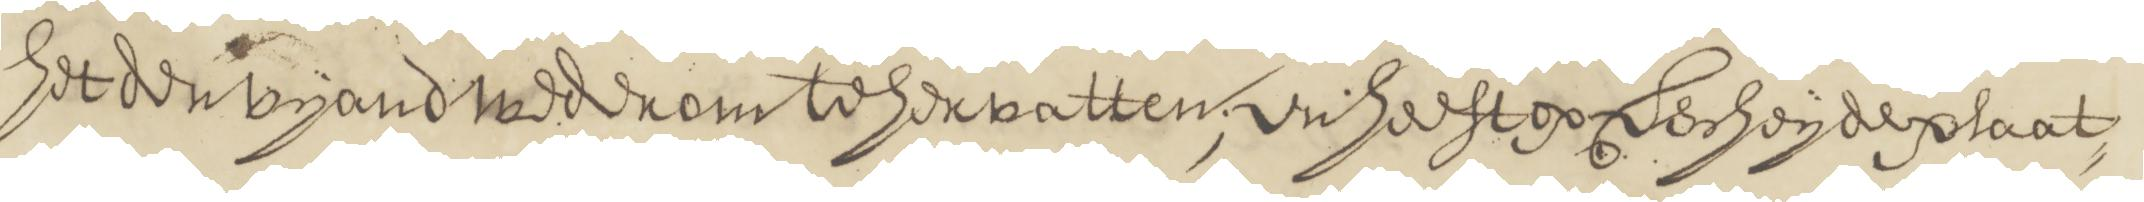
het den vijand wederom te hervatten; en heeft op verscheijde plaat„
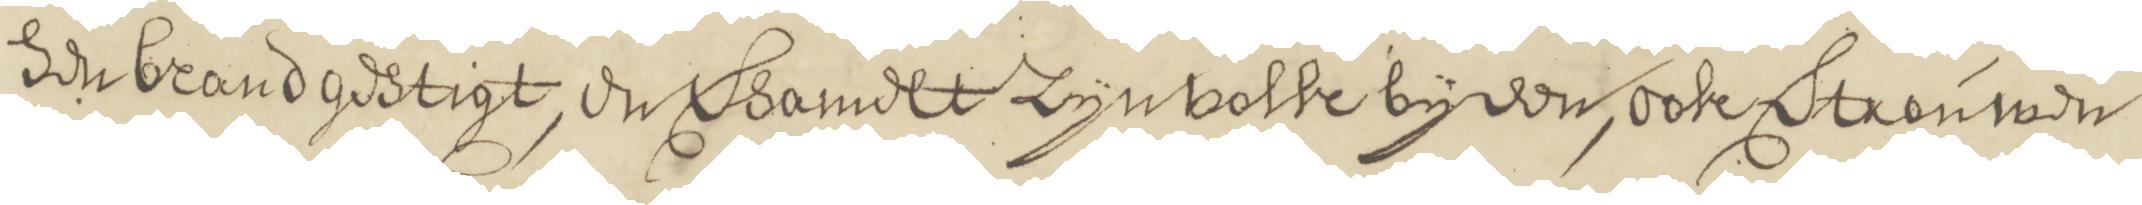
sen brand gestigt, en versamelt Zijn volk bij een, ook vertrouwen
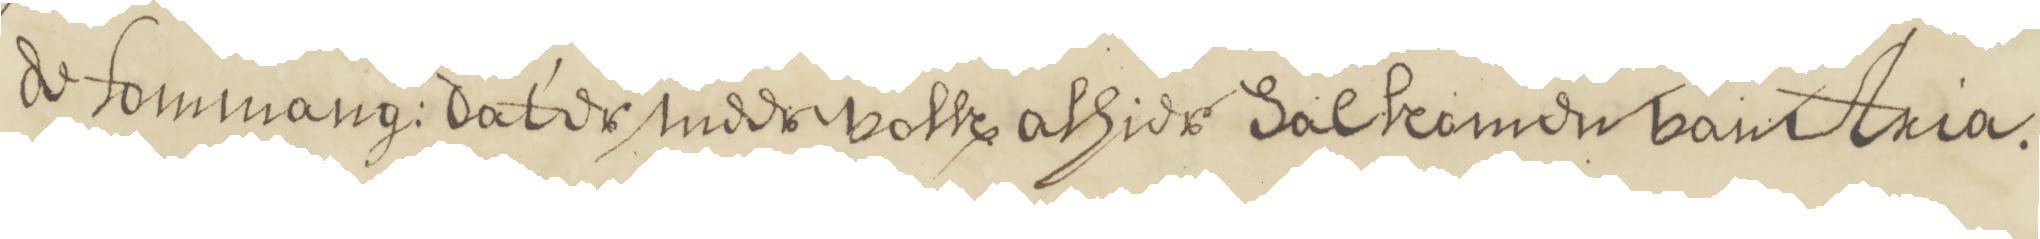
de tommang:' dat'er meer volk alhier sal komen van Aria.
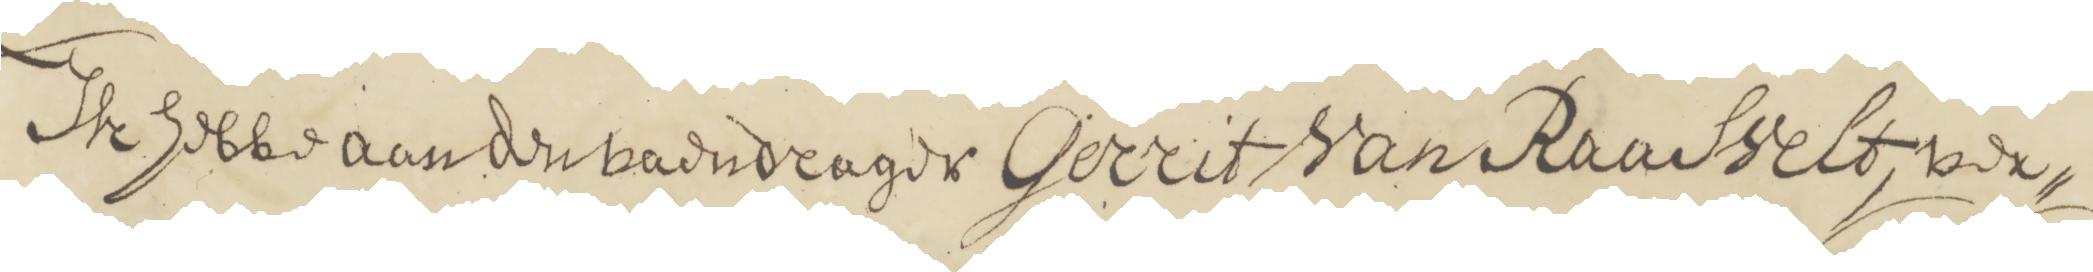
Ik hebbe aan den vaendrager Gerrit Van Raasvelt, ver„
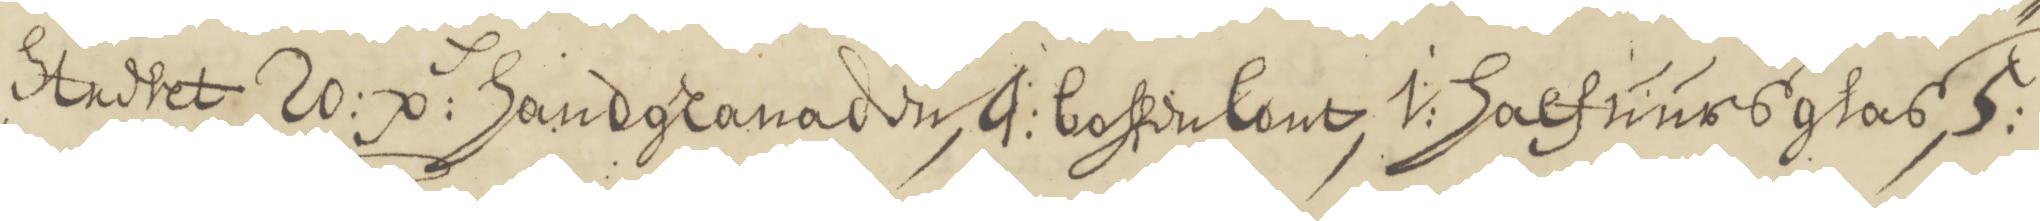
strekt 20: p:s handgranaden, 4: bossen lont, 1: half uurs glas, 5:
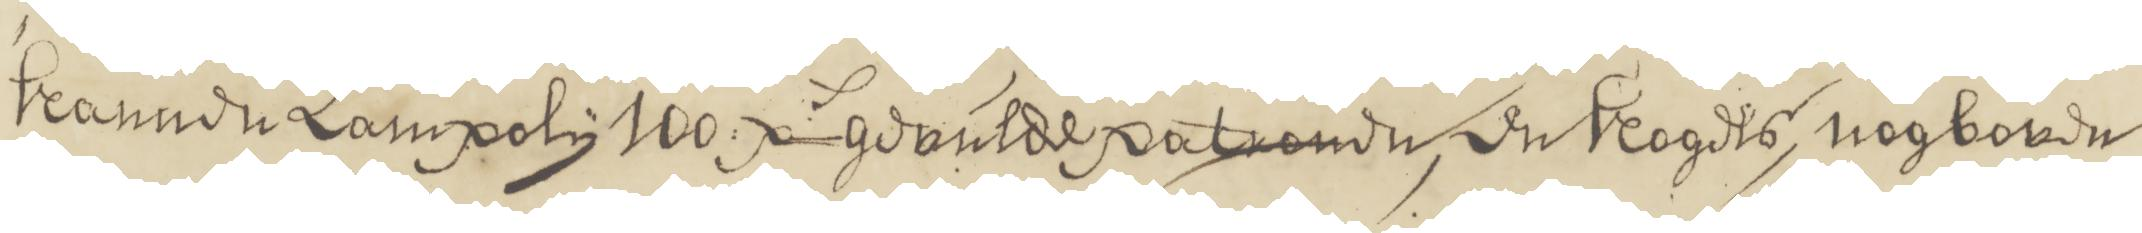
kannen Lampolij 100: p=s gevulde patronen, en kogels, nog boven
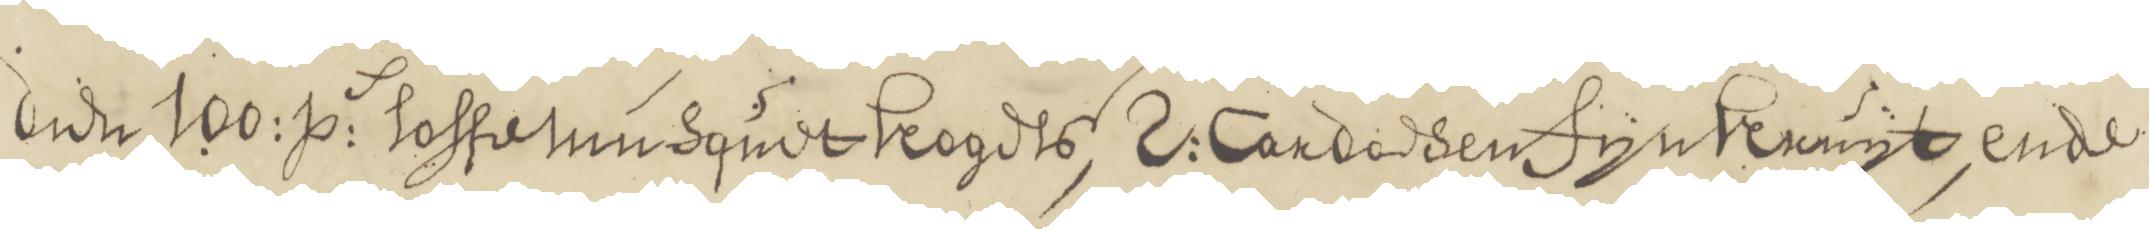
dien, 100: p:s losse musquet kogels, 2: Cardoesen Sijn kruijt, ende
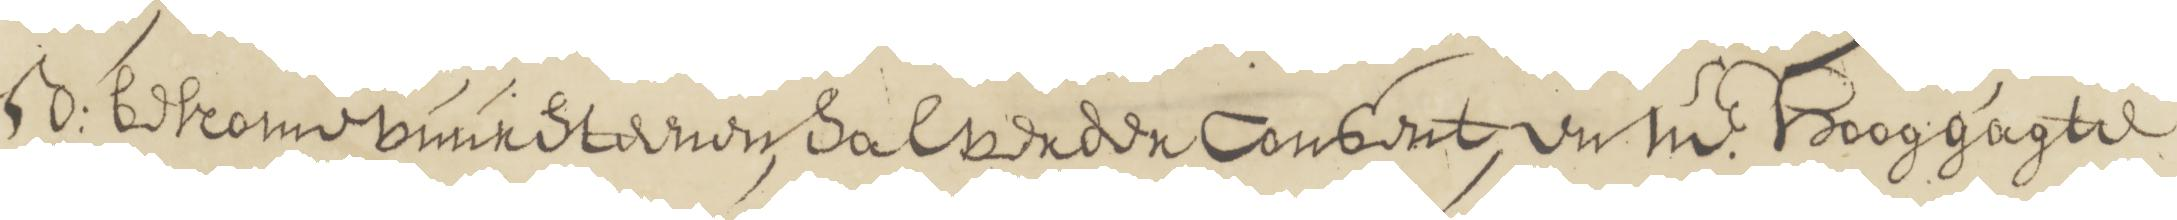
50: bekome vuursteenen, Sal verder consent, en uE: Hoog g'agte
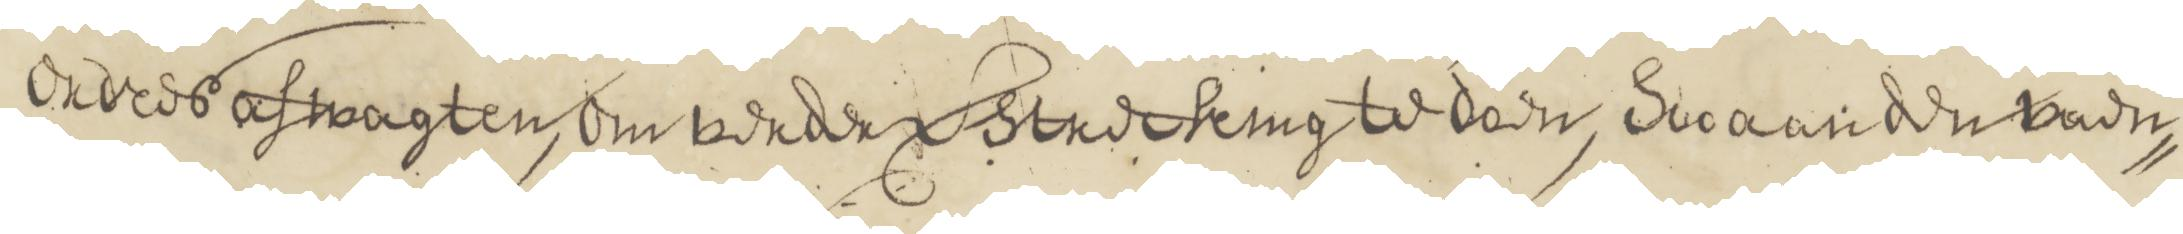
ordres afwagten, om verder verstrecking te doen, soo aan den vaen„
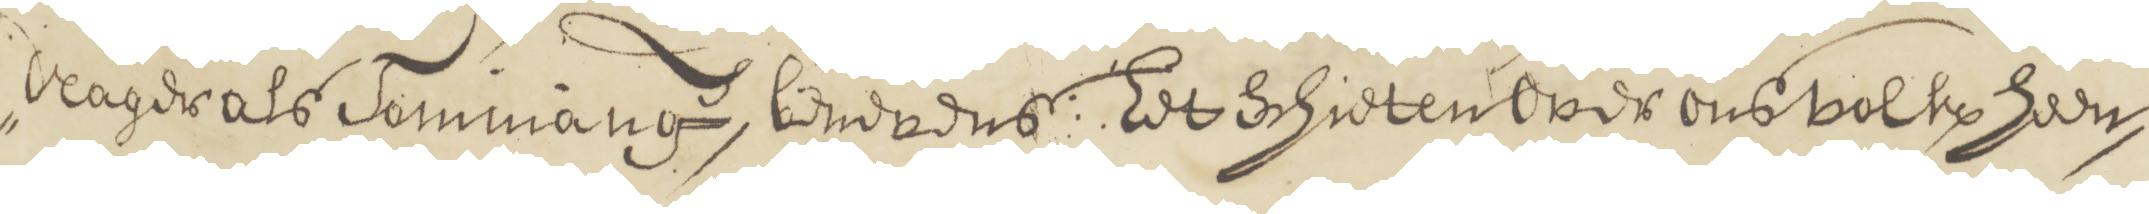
„drager als Tommang=', benevens: het schieten over ons volk heen,
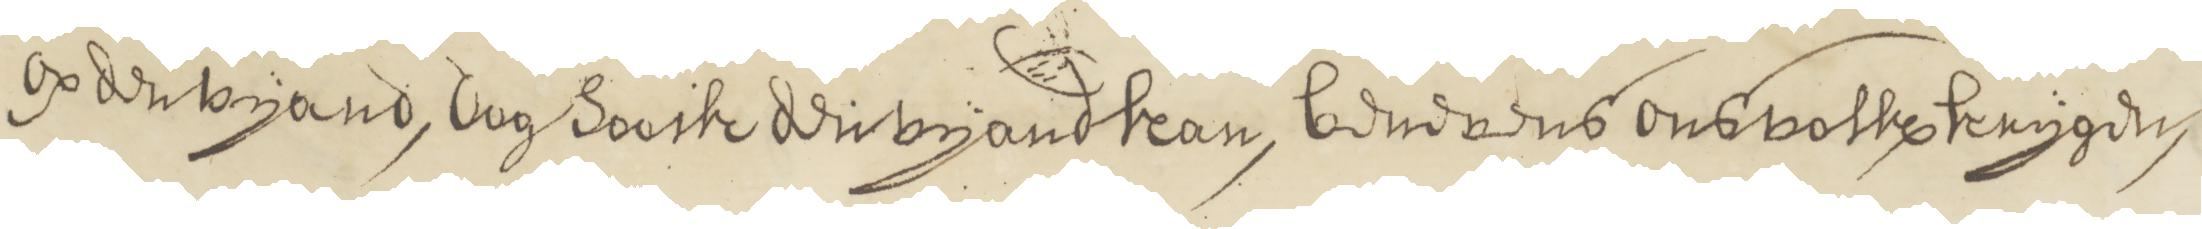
op den vijand, dog soo ik den vijand kan, benevens ons volk krijgen,
